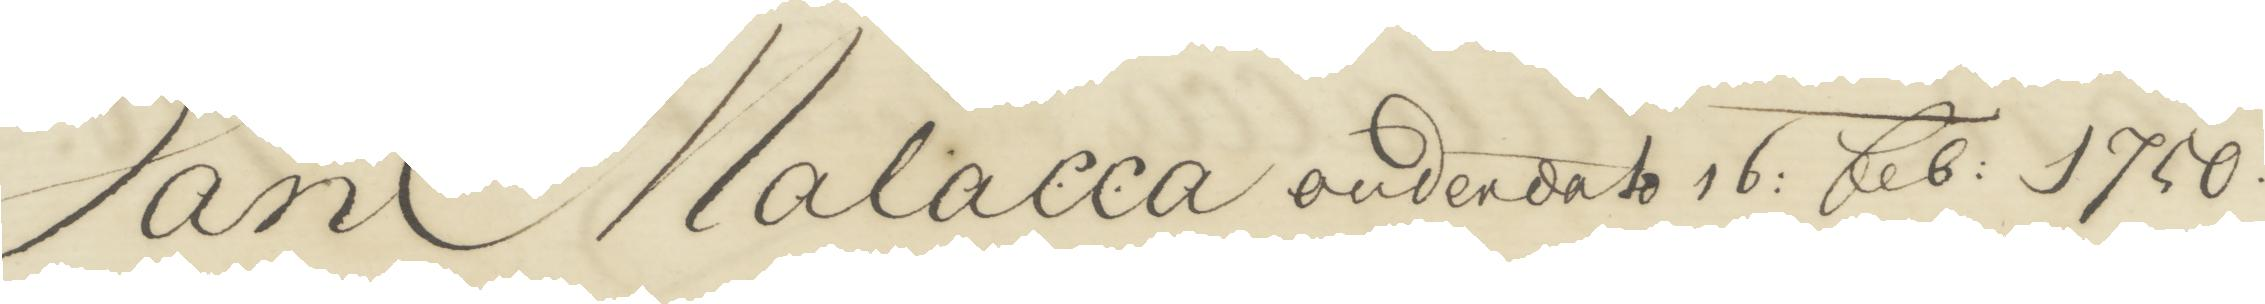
Van Malacca onderdato 16: feb: 1750.
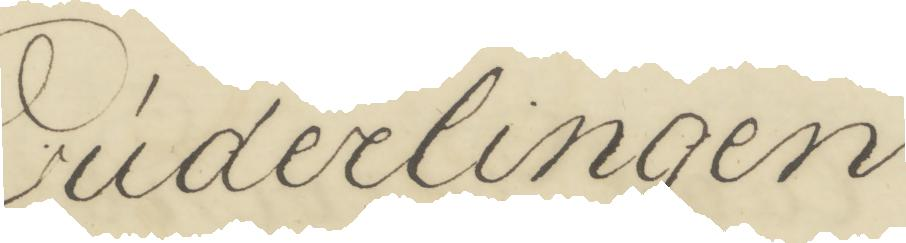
Ouderlingen
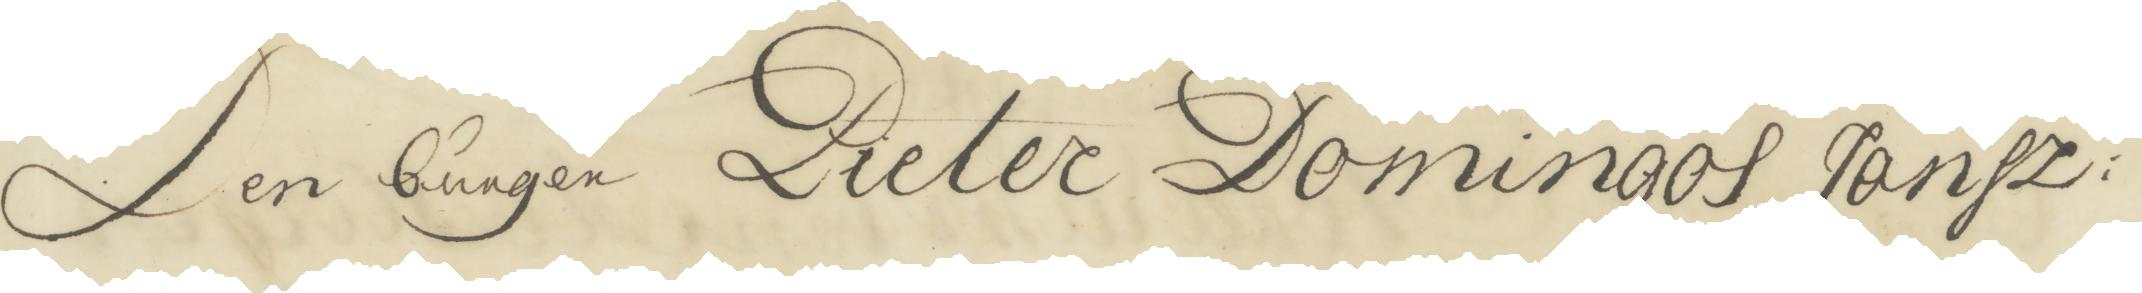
Den burger Pieter Domingos Jansz:
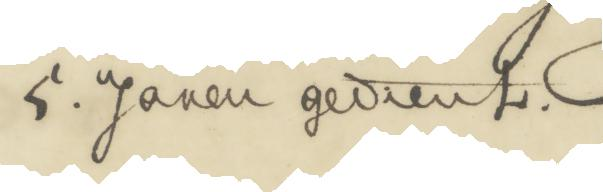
5. Jaren gedient.
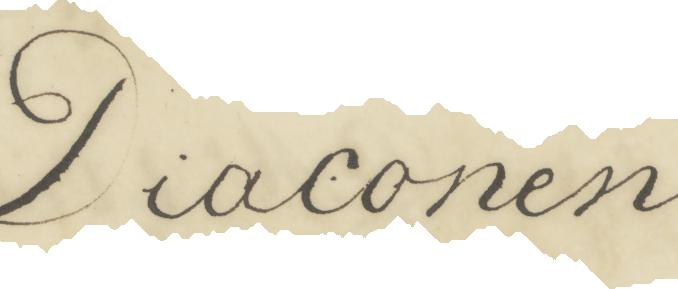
Diaconen
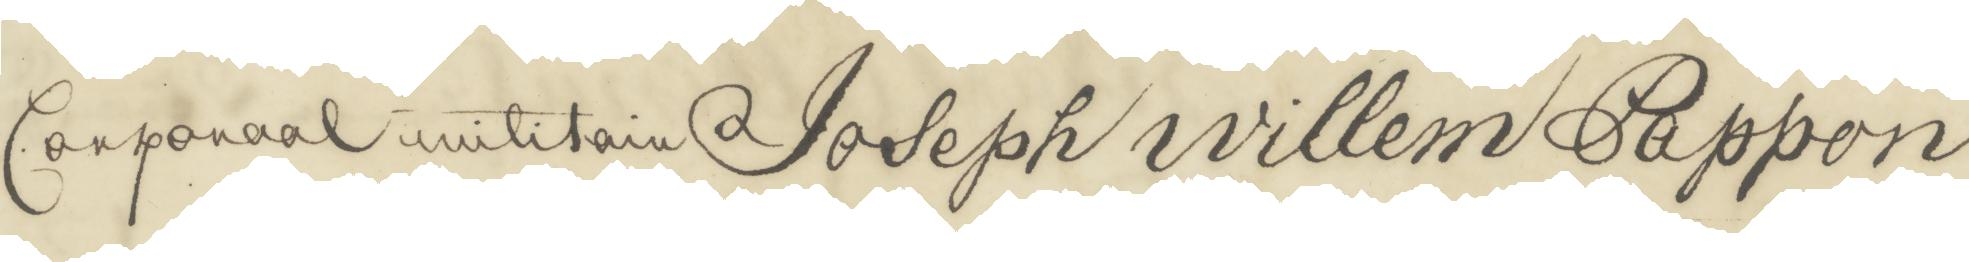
Corporaal militair Joseph willem Pappon
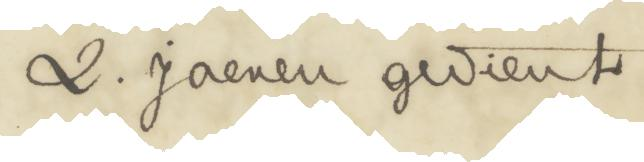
2. jaeren gedient
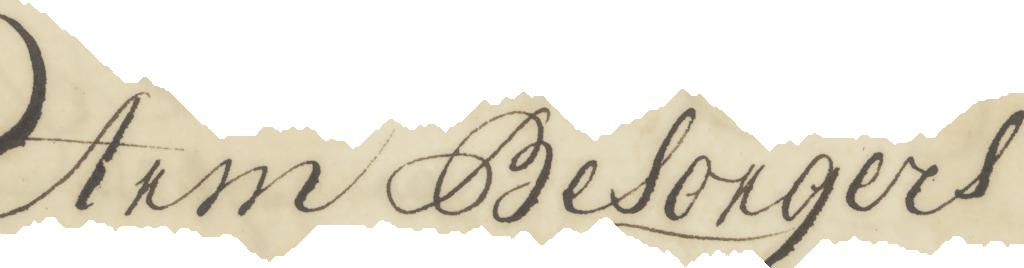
Arm Besorgers
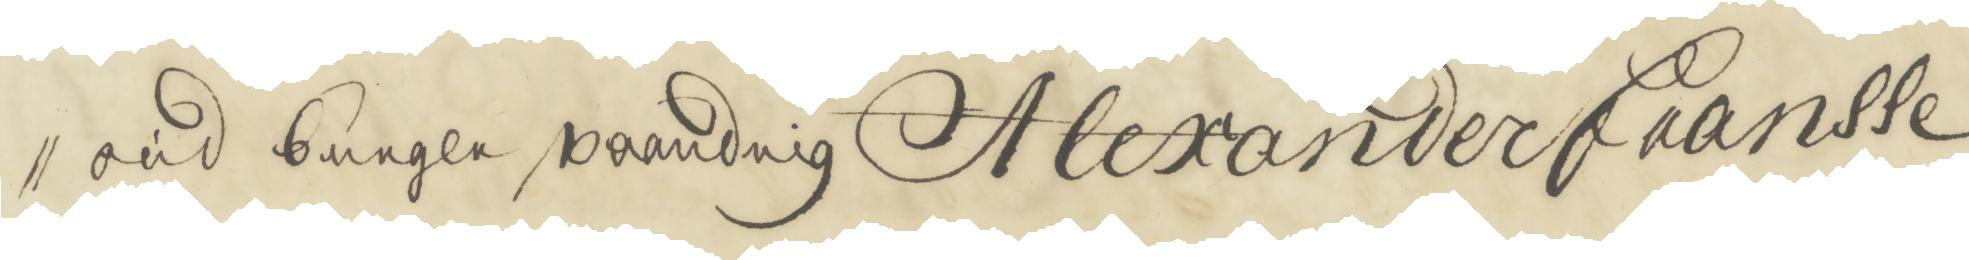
„ oud burger vaandrig Alexander fransse
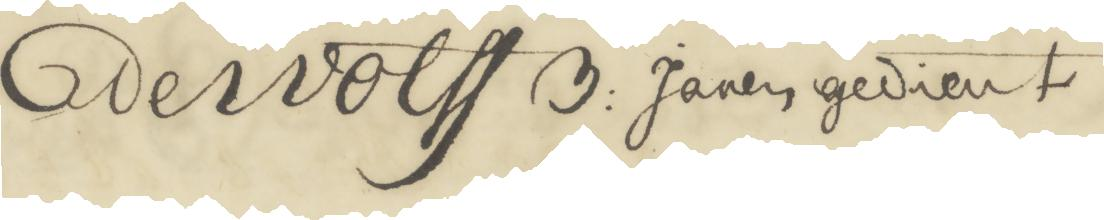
de wolff 3: jaren gedient
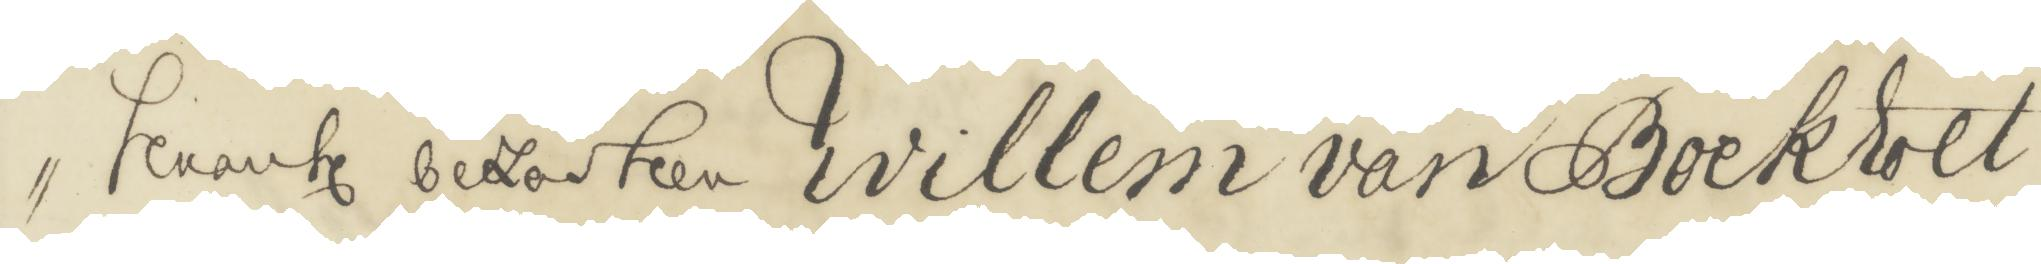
„ krank bezoeker Willem van Boekholt
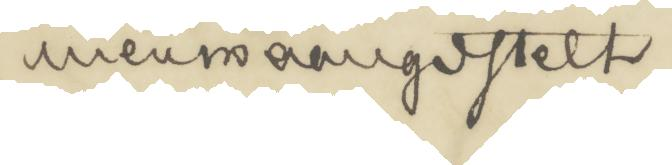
nieuw aangestelt
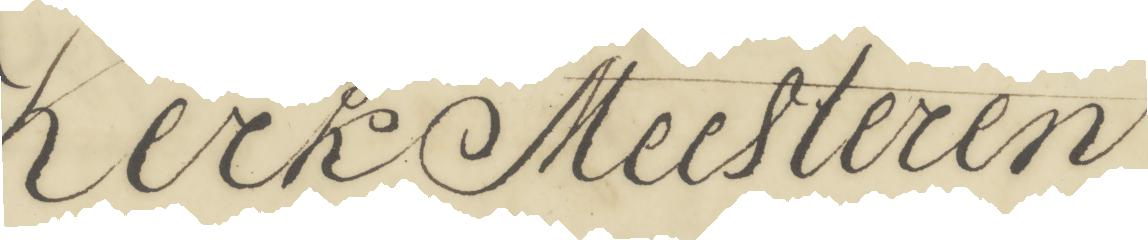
Kerk Meesteren
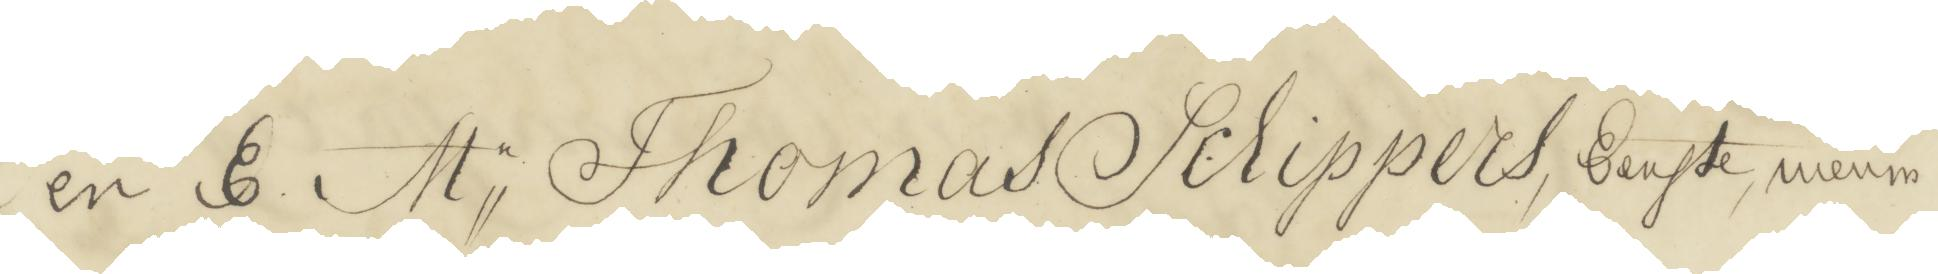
Den E. M„r Thomas Schippers, Eerste, nieuw
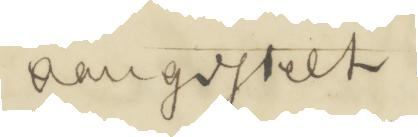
aangestelt
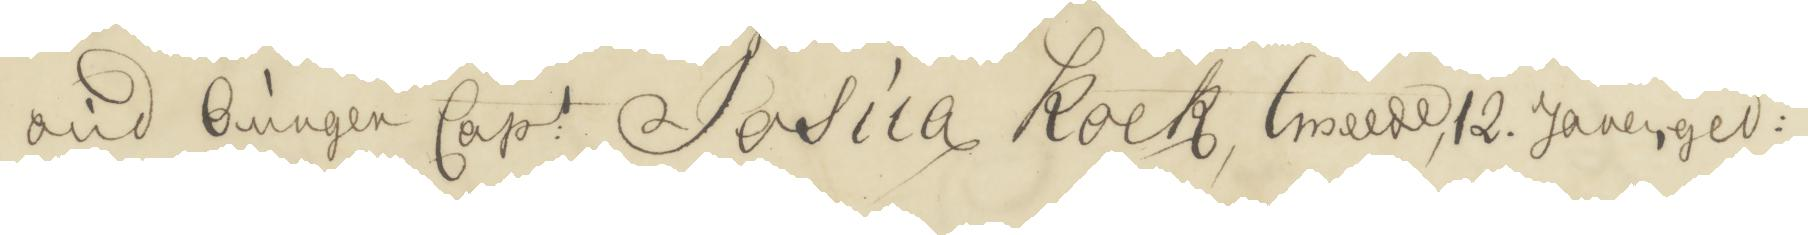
oud burger Cap:t Josua Koek, tweede, 12. Jaren ged:t
